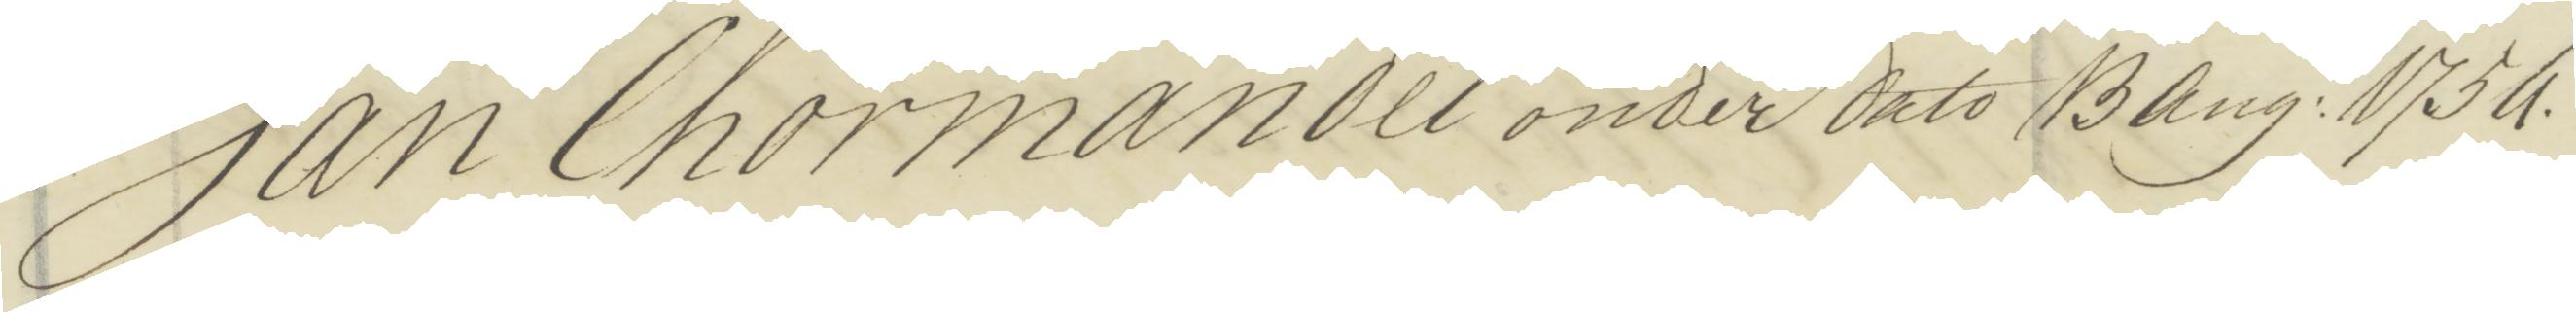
Van Chormandel onder dato 13 aug:s 1754.
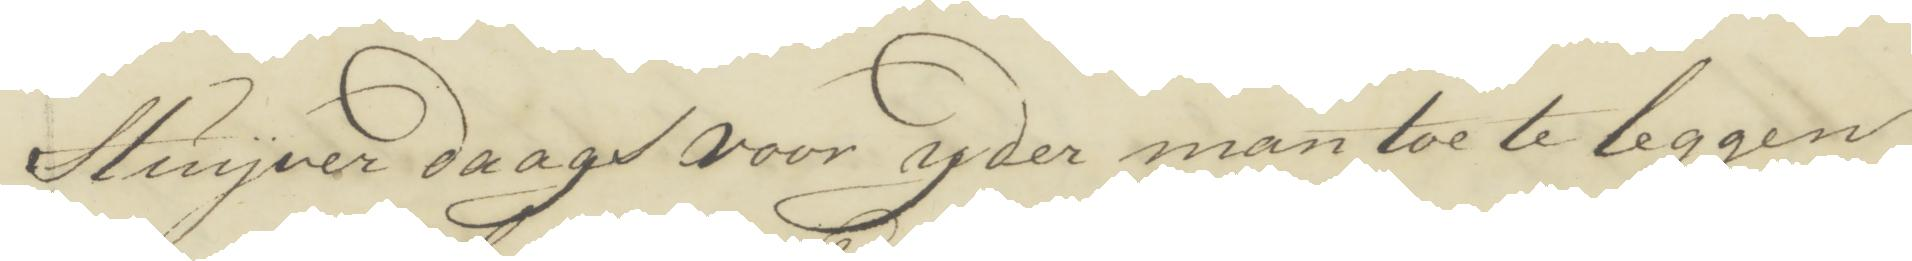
stuijver daags voor yder man toe te leggen
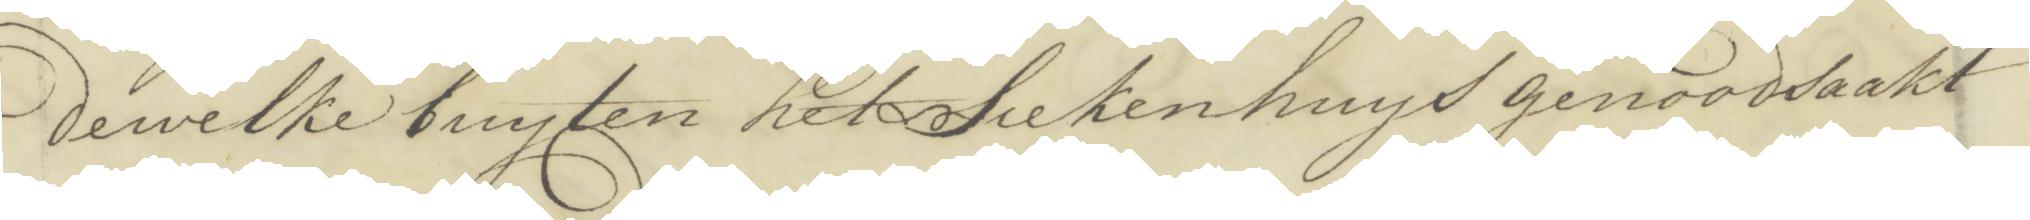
dewelke buyten het siekenhuys genoodsaakt
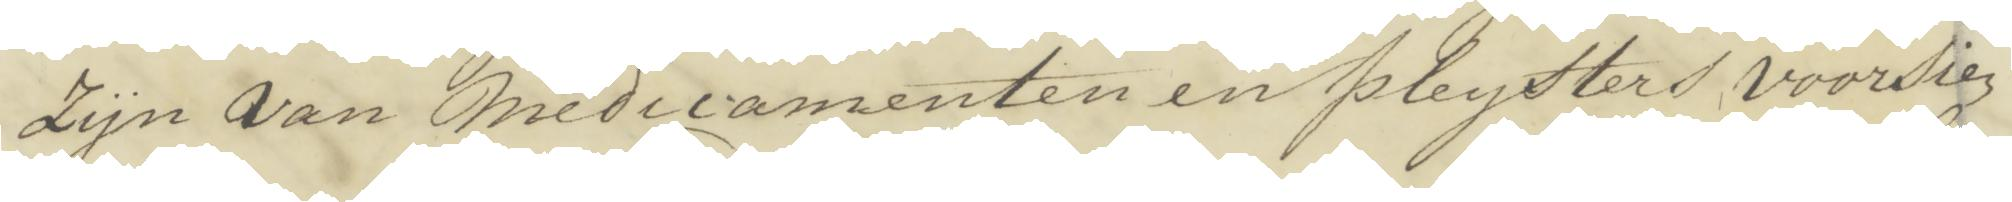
zijn van medicamenten en pleysters voorsien
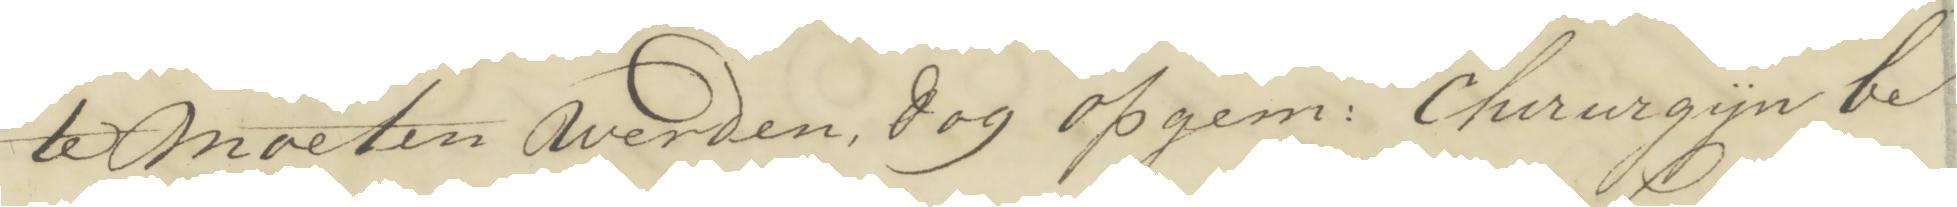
te moeten werden, dog opgem: chirurgijn be
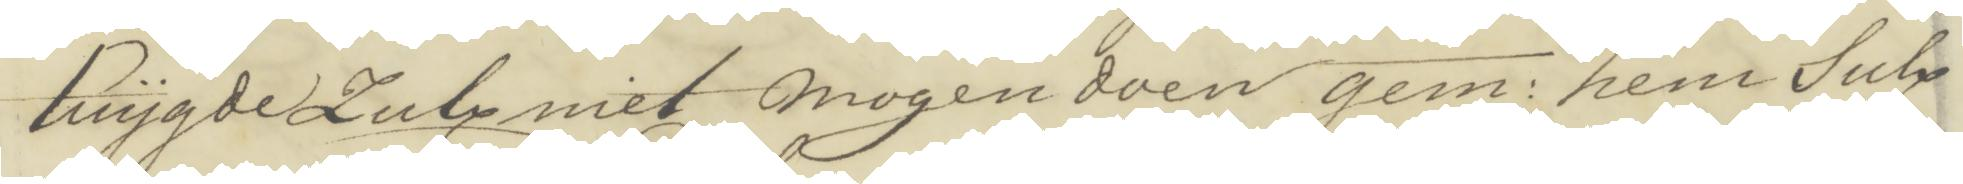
tuijgde zulx niet mogen doen gem: hem sulx
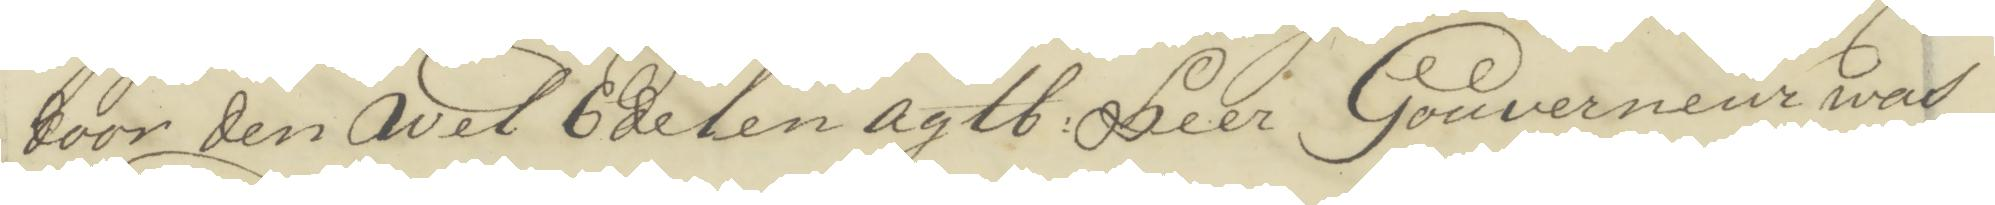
door den wel Edelen agtb: Heer Gouverneur was
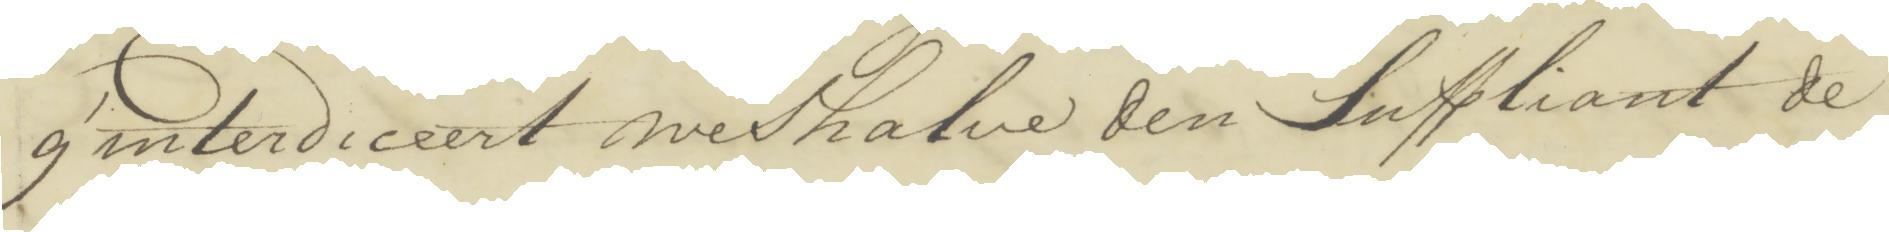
g'interdiceert weshalve den Suppliant de
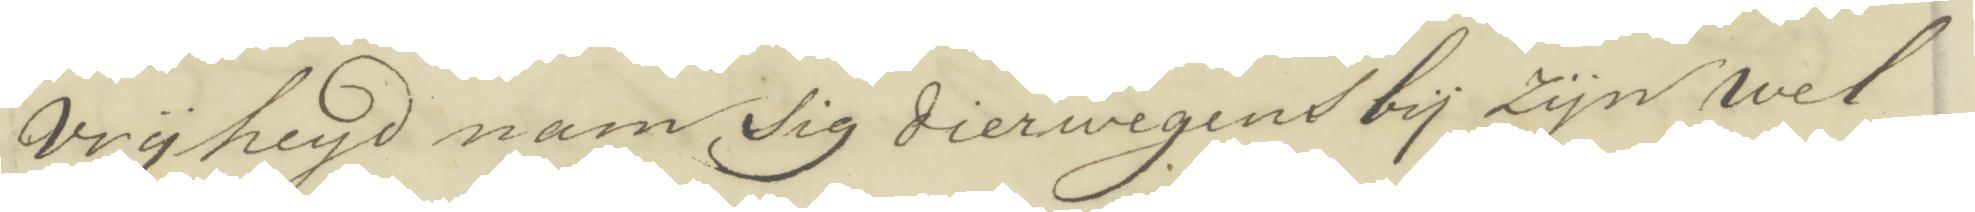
vrijheyd nam sig dierwegens bij zijn wel
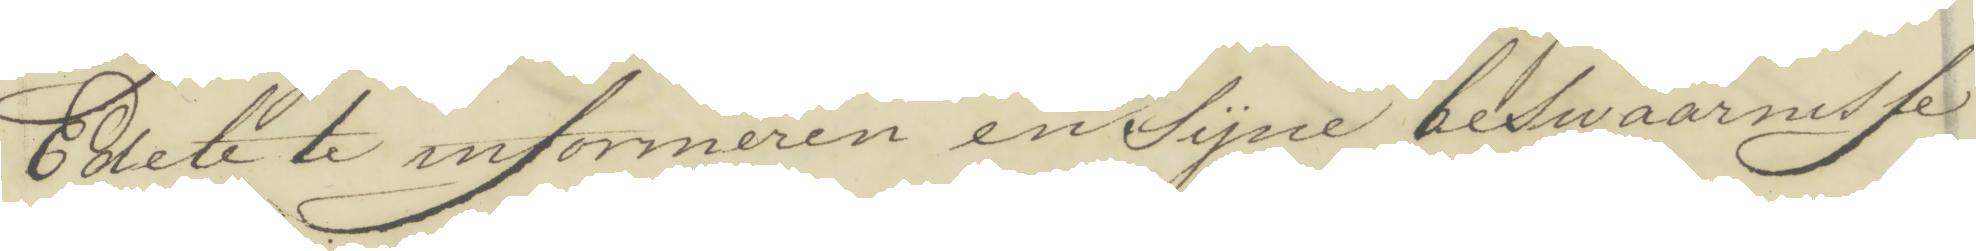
Edele te informeren en Sijne beswaarnisse
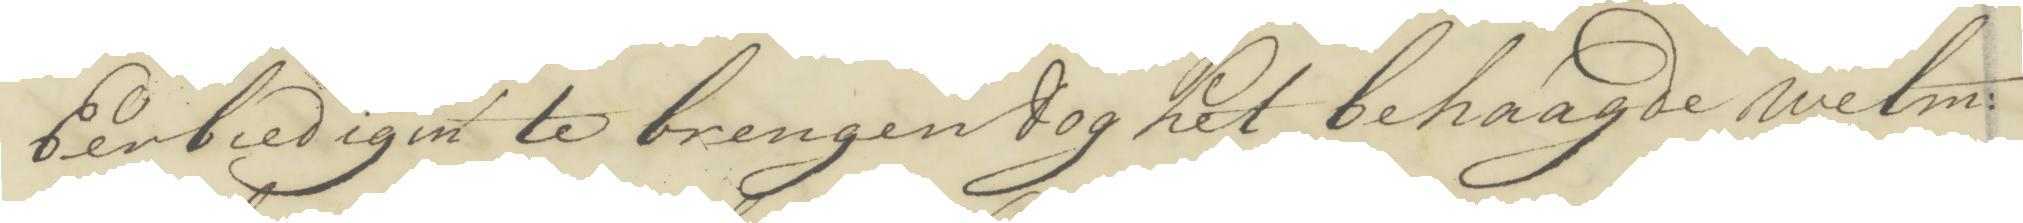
Eerbiedig in te brengen dog het behaagde welm:
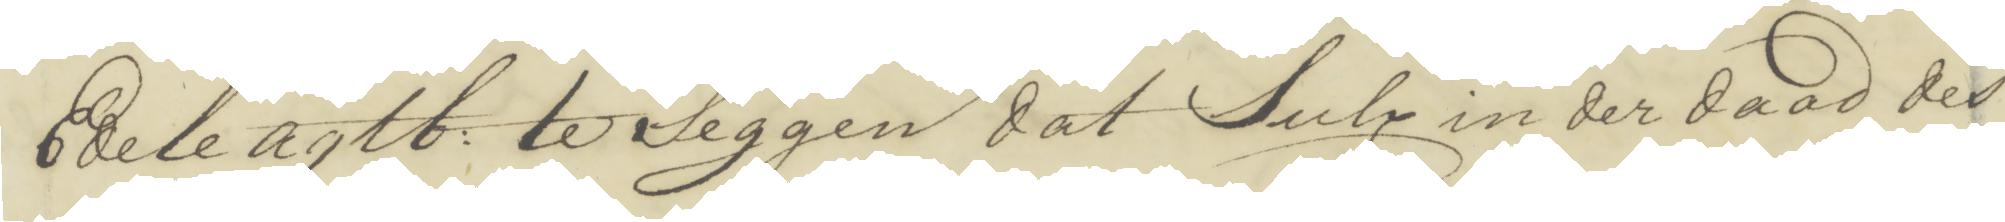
Edele agtb: te seggen dat Sulx in der daad des
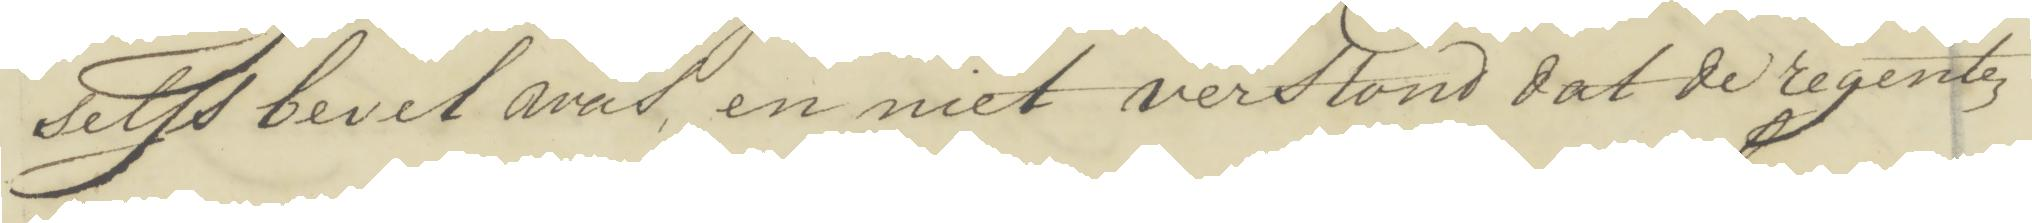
selfs bevel was, en niet verstond dat de regenten
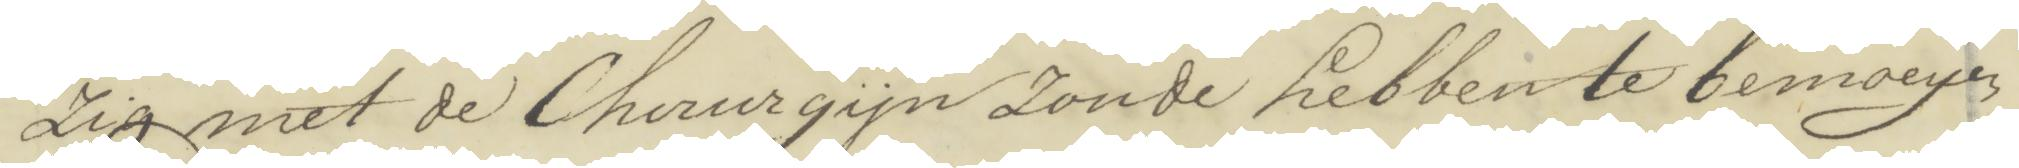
zig met de Chirurgijn zoude hebben te bemoeyen
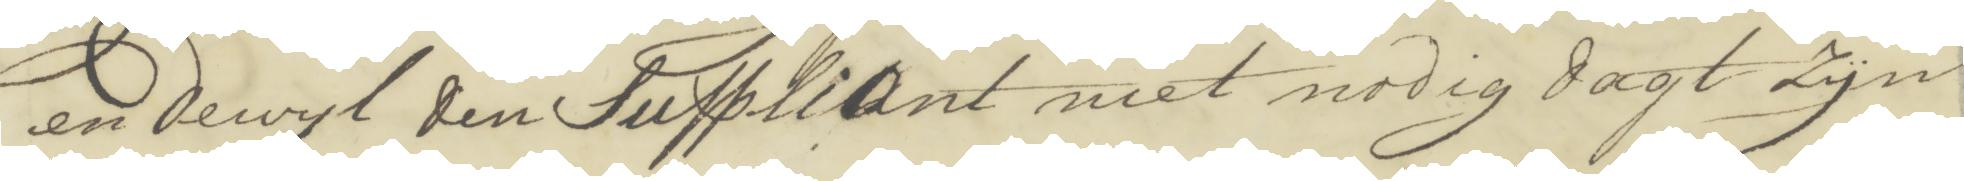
en dewyl den Suppliant niet nodig dagt Zijn
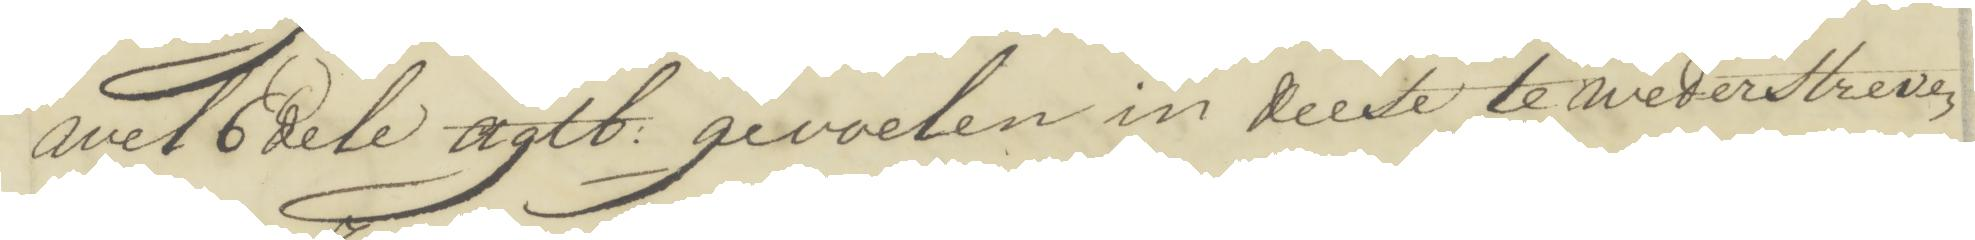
wel Edele agtb: gevoelen in deese te wederstreven
